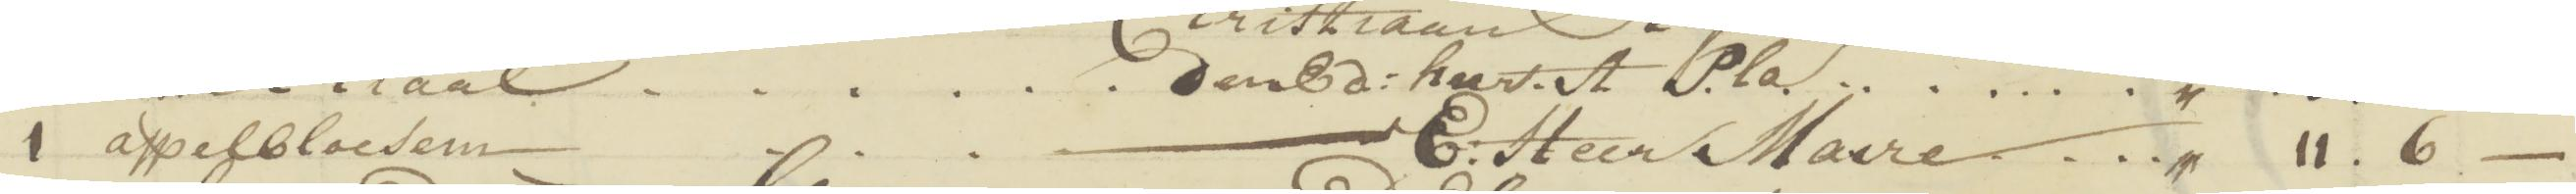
1 appelbloesem . . . — E: Heer Maire . . . . „ 11. 6. —
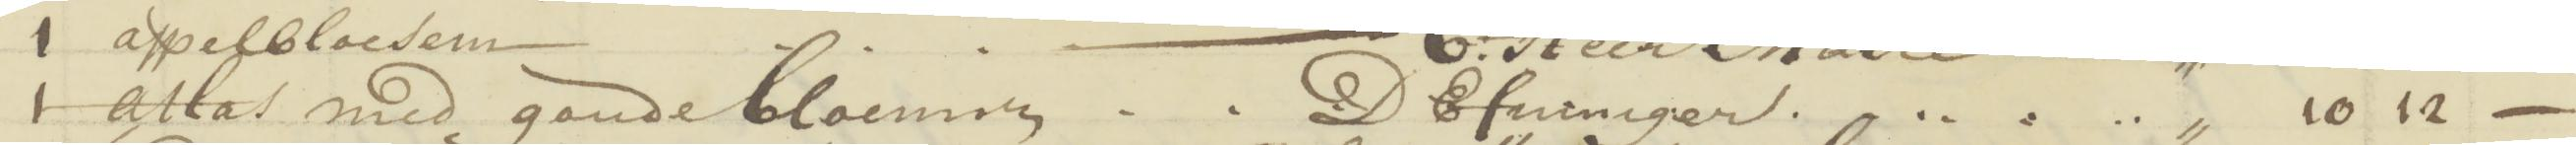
1 atlas med goude bloemen . . .D Efninger. .. .. .. „ 10 12 —
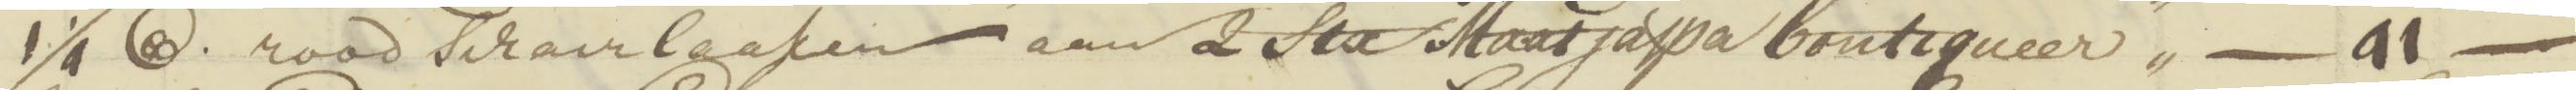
1¼ @. rood schairlaaken aan 2 stx Maatjappa boutiqueer „ — 41 —
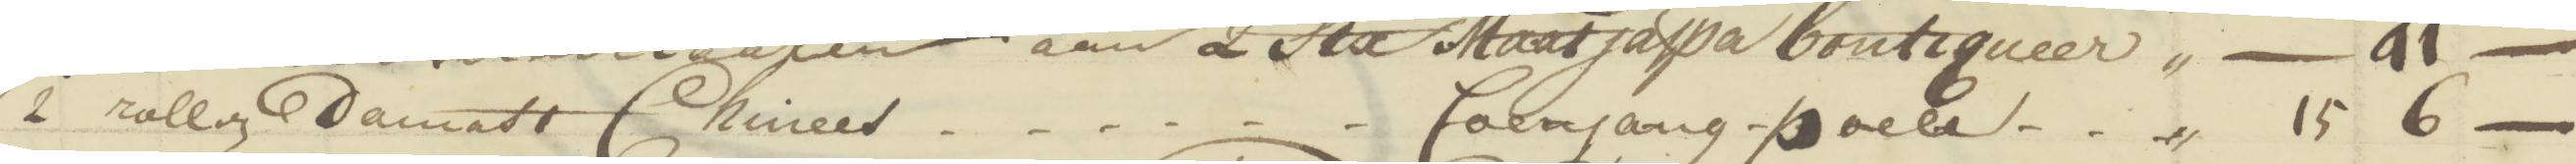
2 rollen damast Chinees . - - - - - Coenjang-poele- - .„ 15 6 —
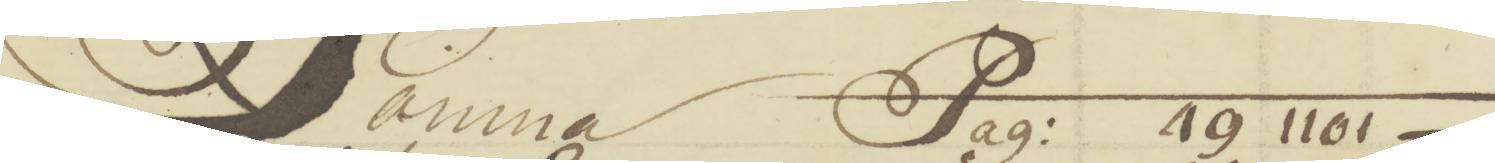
Somma Pag: 49 1101 —
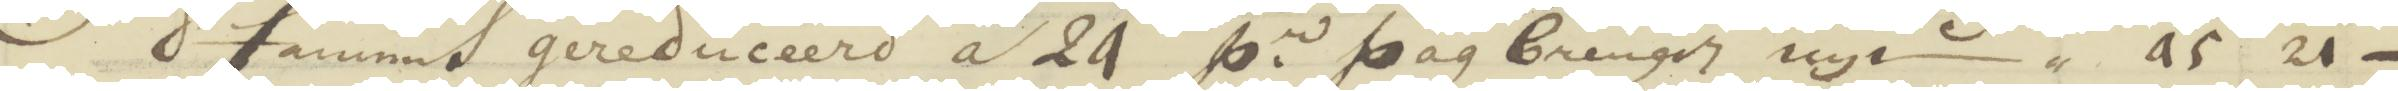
d' famnus gereduceerd a 24 p.r pag brengen uyt „ 45: 21—
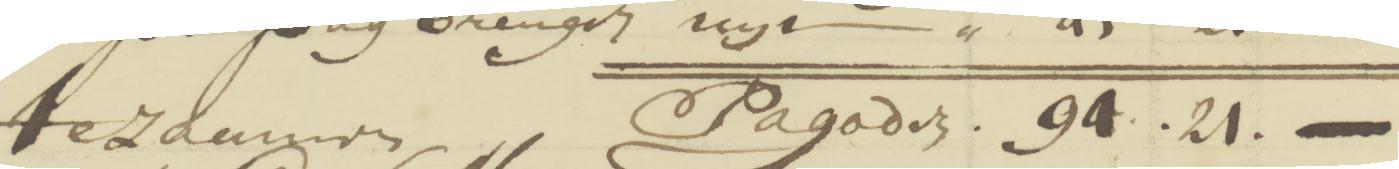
te zaamen Pagoden. 94.21. —
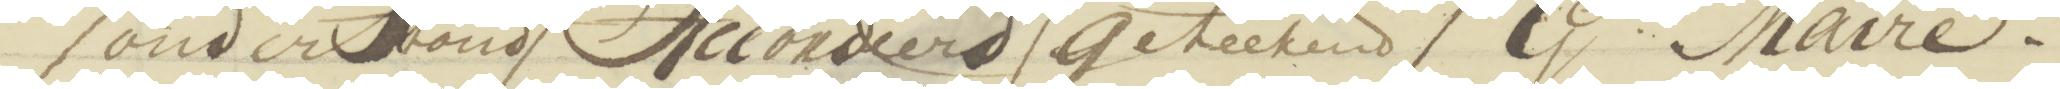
/onderstond/ Accordeerd /geteekend/ G:n Maire-
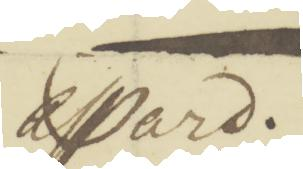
appard.
